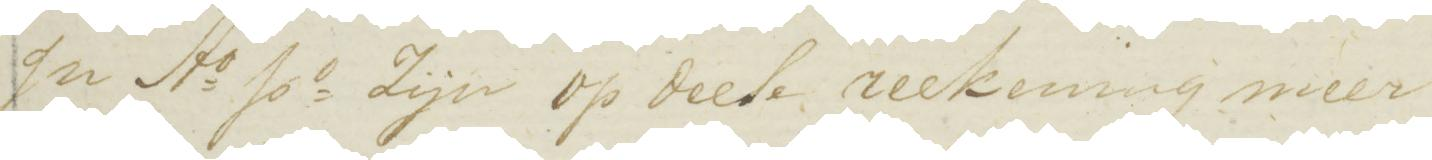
Jn A=o p=o Zijn op deese reekening meer
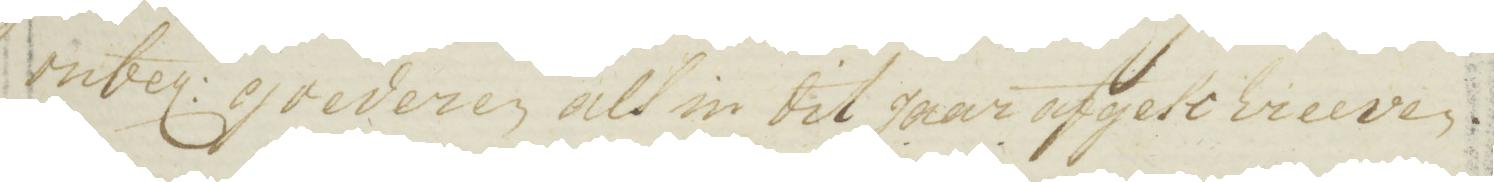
onbeq: goederen als in dit jaar afgeschreeven.
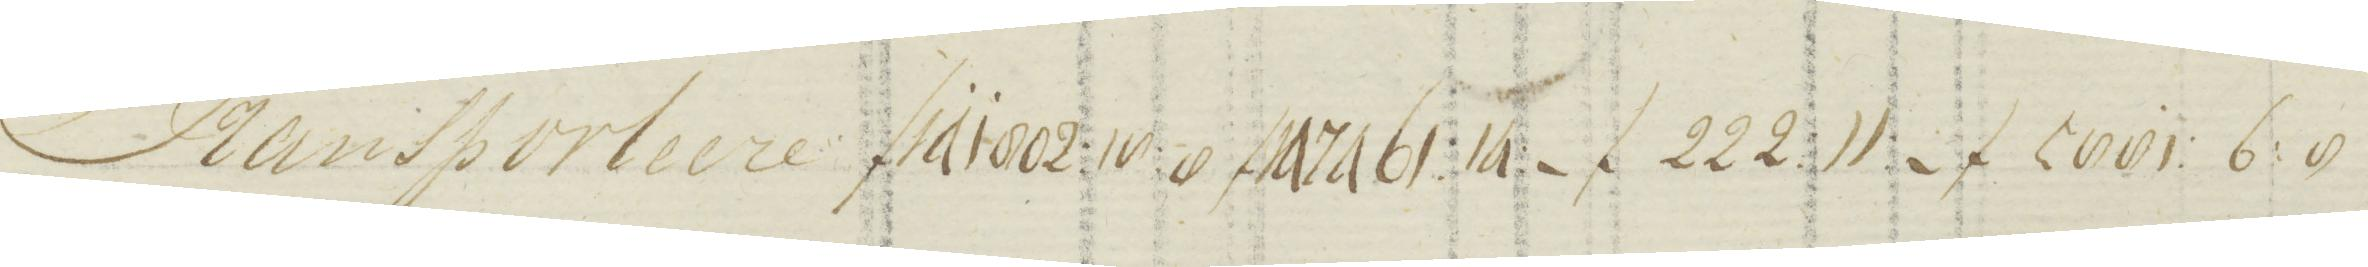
Transporteere ƒ41802:18:8 ƒ147461:14:- ƒ222:11:- ƒ5881:6:8
